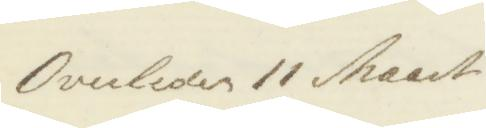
Overleden 11 Maart
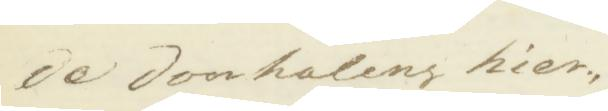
de doorhaling hier„
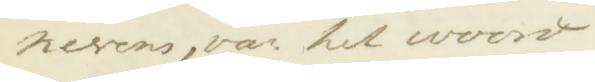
nevens, van het woord
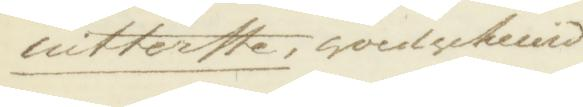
uitterste, goedgekeurd
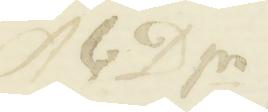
AVD jr
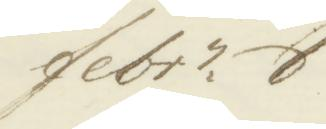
febr:y 8
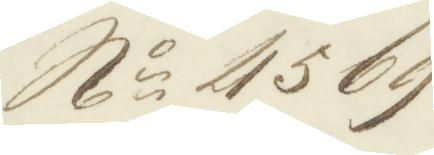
N=o 4569
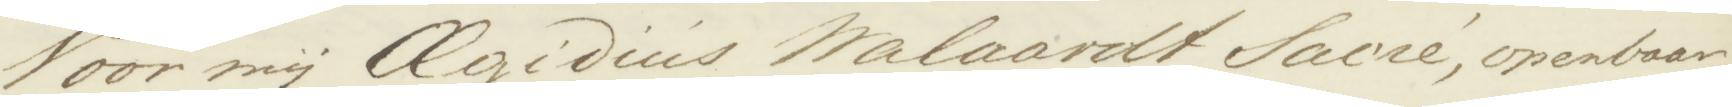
Voor mij AEgidius Walaardt Sacré, openbaar
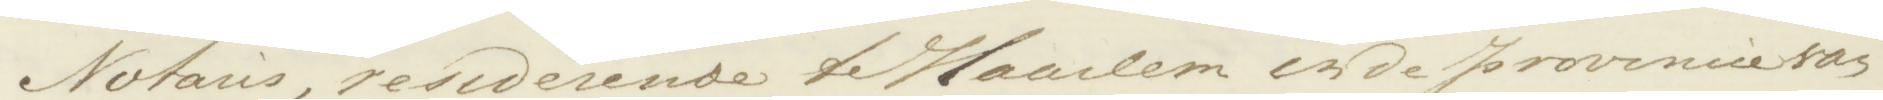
Notaris, residerende te Haarlem in de provincie van
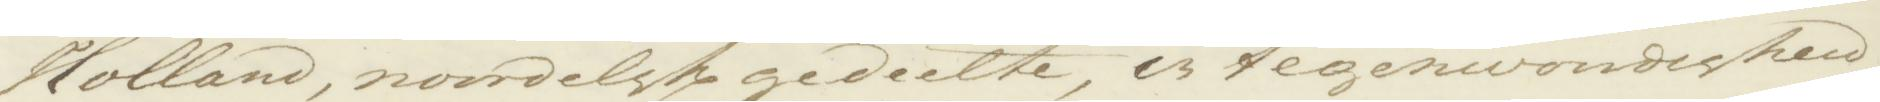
Holland, noordelyk gedeelte, in tegenwoordigheid
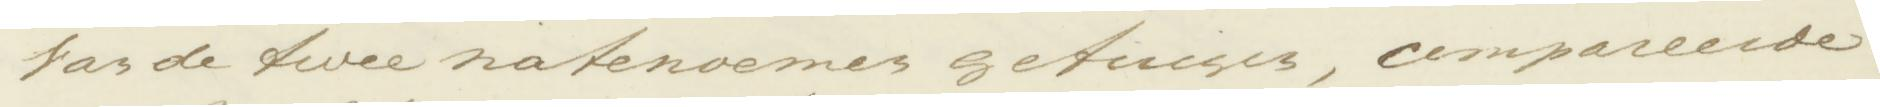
van de twee natenoemen getuigen compareerde
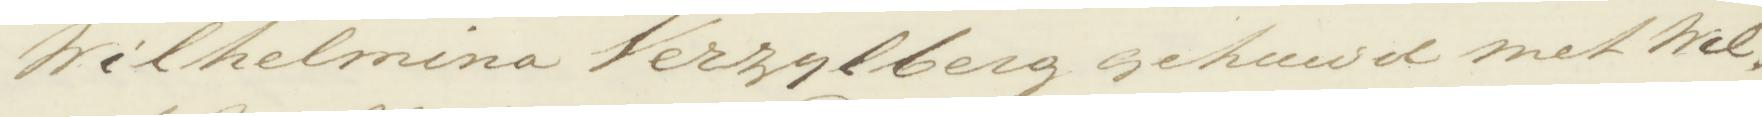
Wilhelmina Verzylberg gehuwd met Wil
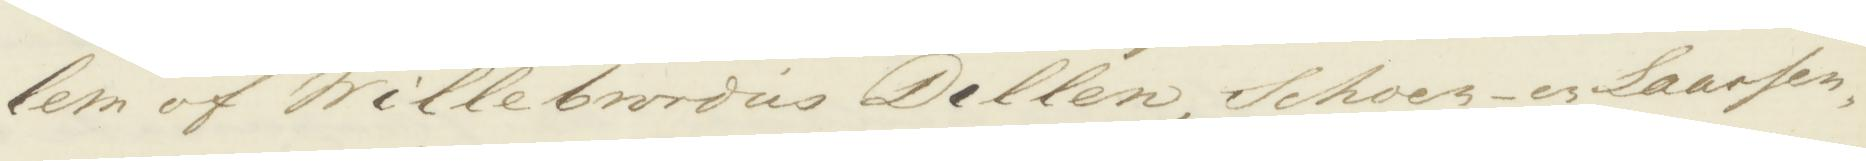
lem of Willebrordus Dillen, schoen-en Laarsen„
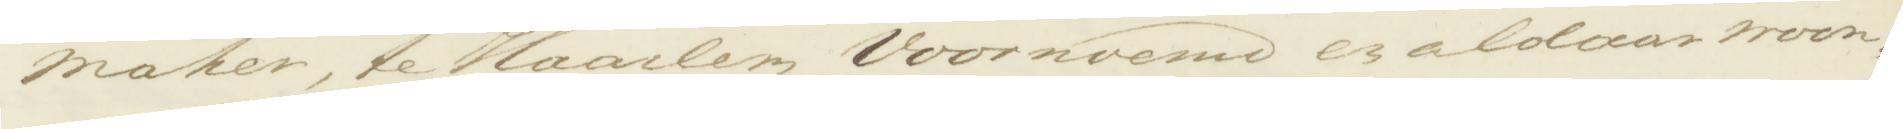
maker, te Haarlem voornoemd en aldaar woon„
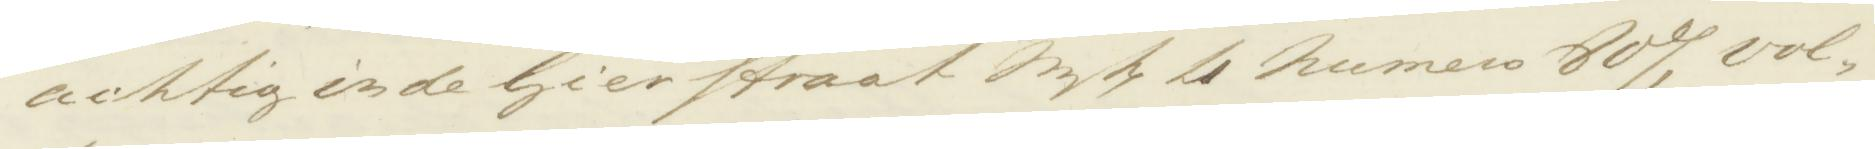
achtig in de Gierstraat Wyk 4 numero 807, vol„
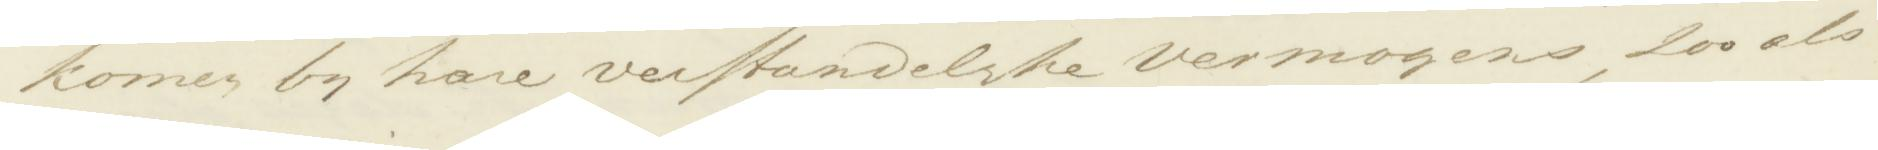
komen by hare verstandeljke vermogens, zoo als
